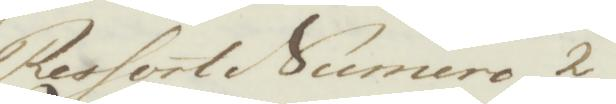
Ressort Numero 2
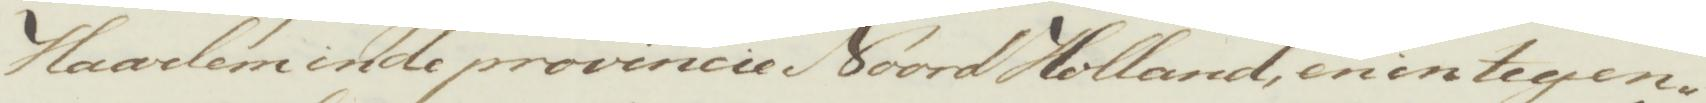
Haarlem in de provincie Noord Holland, en in tegen„
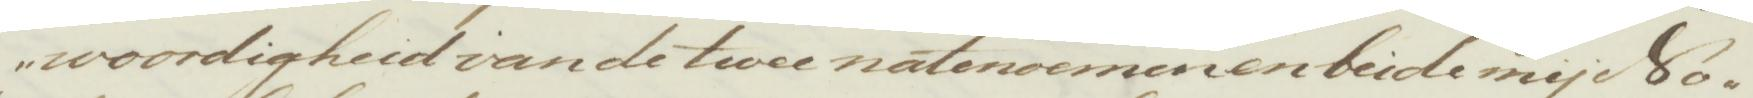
„woordigheid van de twee natenoemen en beide mij No„
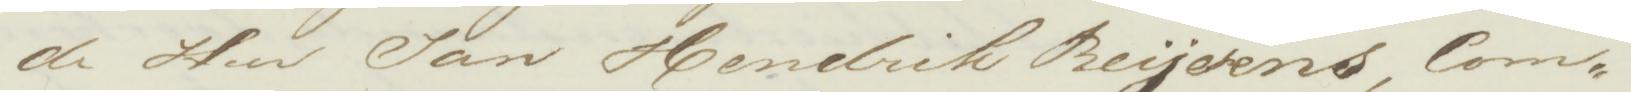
de Heer Ian Hendrik Reijsens, Com„
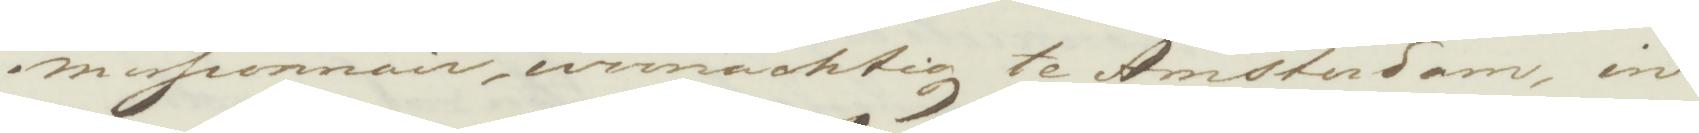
„missionnair, woonachtig te Amsterdam, in
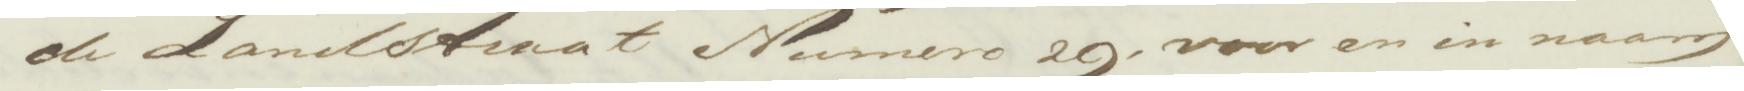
de Zandstraat Numero 29, voor en in naam
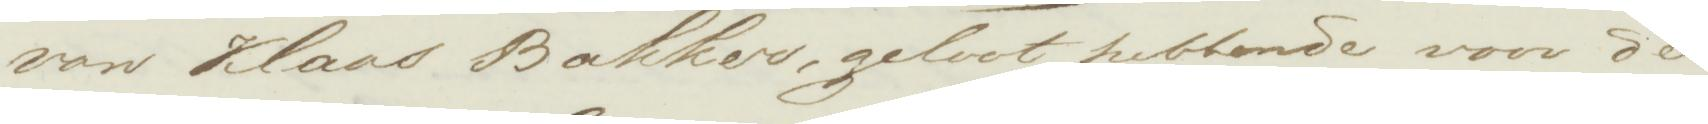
van Klaas Bakkers, geloot hebbende voor de
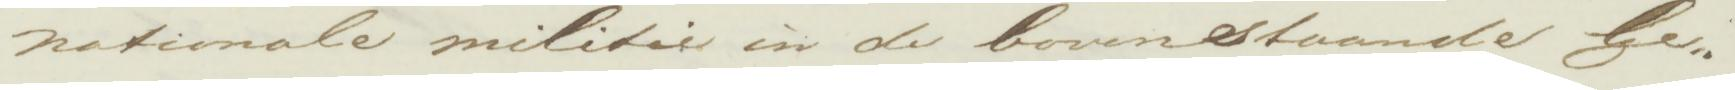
nationale militie in de bovenstaande Ge„
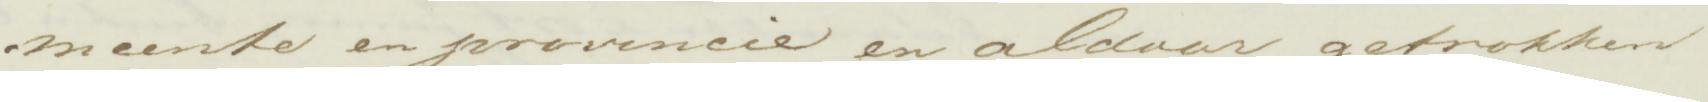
„meente en provincie en aldaar getrokken
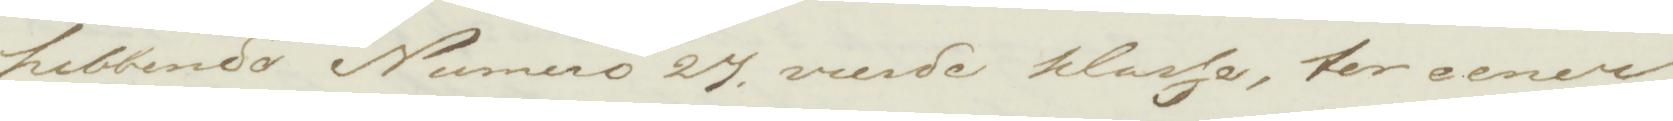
hebbende Numero 27, vierde klasse, ter eener
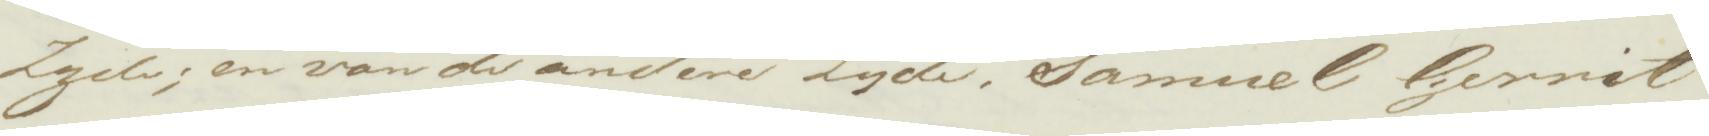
Zyde; en van de andere zijde, Samuel Gerrit
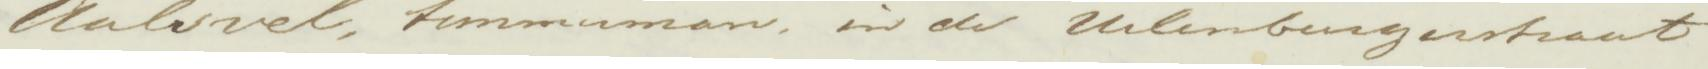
Aalsvel, timmerman, in de Uilenburgerstraat
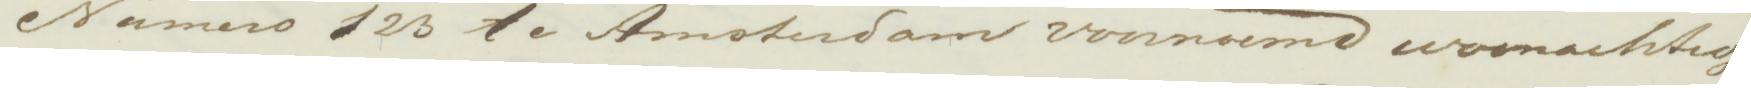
Numero 123 te Amsterdam voornoemd woonachtig
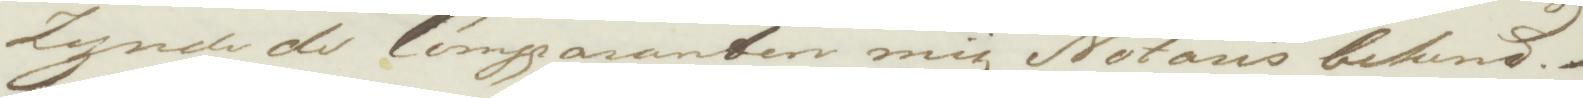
Zynde de Comparanten mij Notaris bekend.
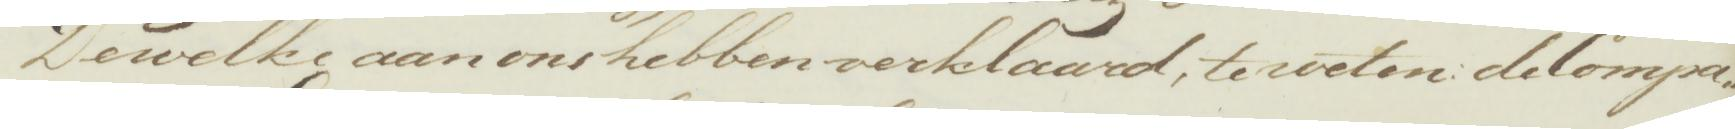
Dewelke aan ons hebben verklaard, te weten: de Compa
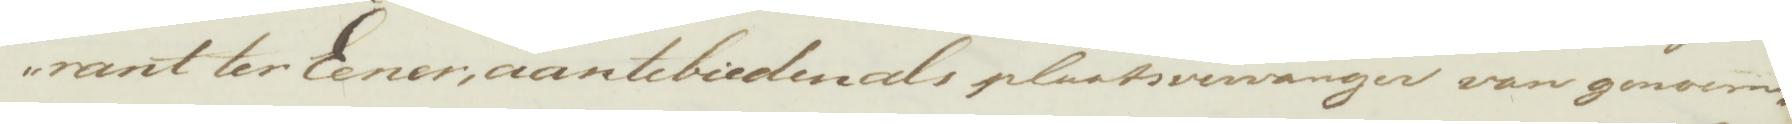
„rant ter Eener, aantebieden als plaatsvervanger van genoem
